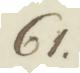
61.
